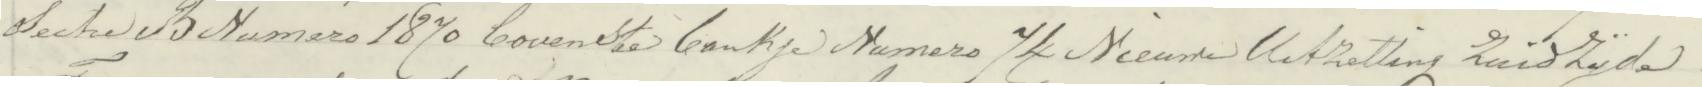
sectie B Numero 1870 bovenste bankje Numero 74 Nieuwe Uitzetting zuidzijde
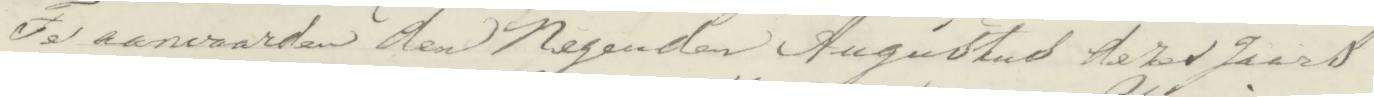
Te aanvaarden den Negenden Augustus dezes Jaars
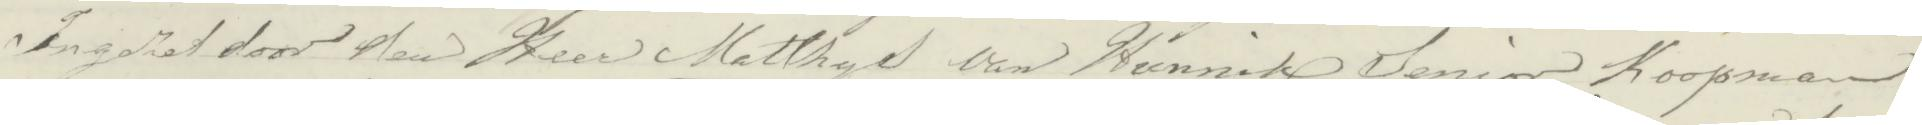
Ingezet door den Heer Matthys van Hunnik Senior Koopman
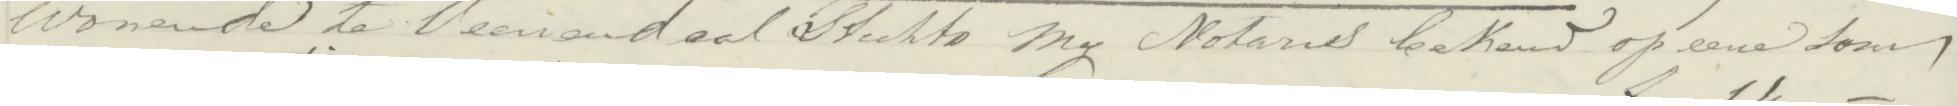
wonende te Veenendaal Stichts my Notaris bekend op eene som
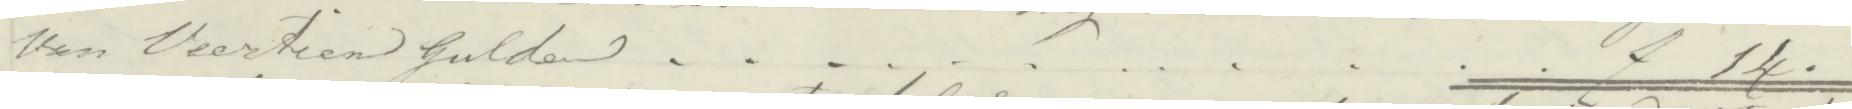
van Veertien Gulden - - - - - - - - - - - ƒ 14.
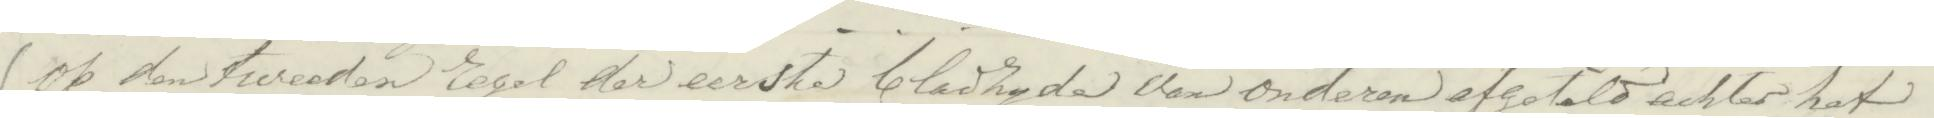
op den tweeden regel der eerste bladzyde van onderen afgeteld achter het
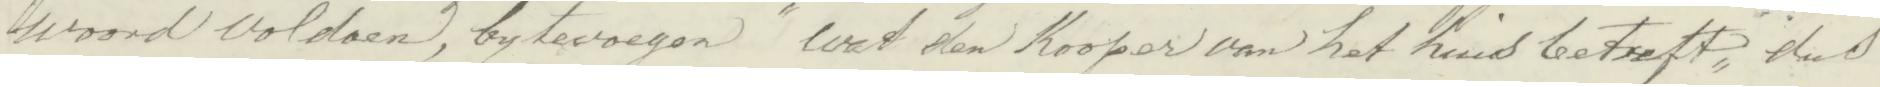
woord voldoen, bytevoegen "wat den kooper van het huis betreft„ dus
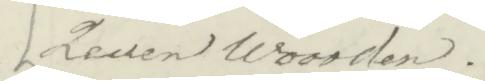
zeven woorden.
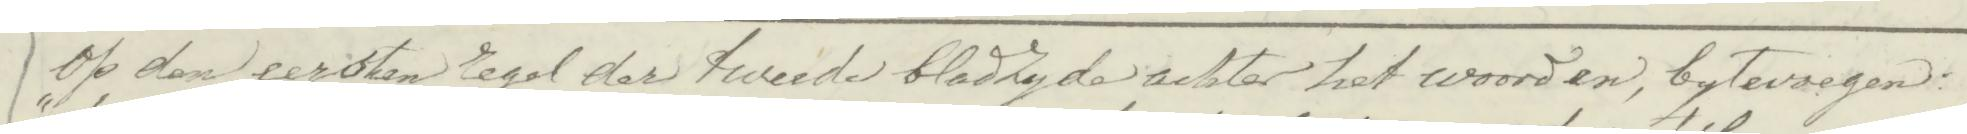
op den eersten regel der tweede bladzyde achter het woord en, bytevoegen
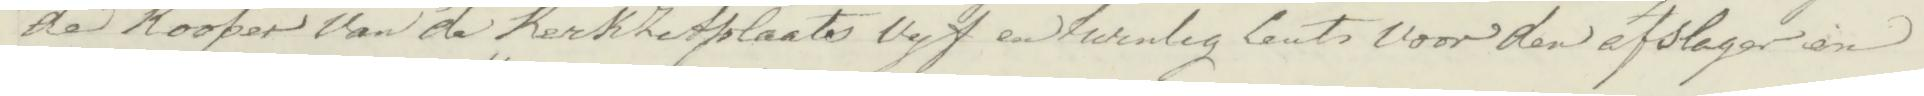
"de kooper van de Kerkzitplaats vyf en twintig Cents voor den afslager en
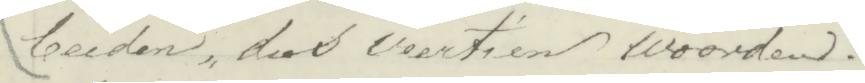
beiden„ dus veertien woorden.
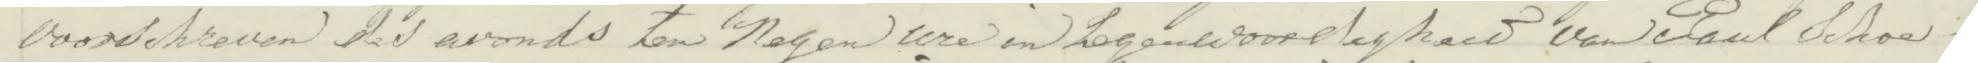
voorschreven des avonds ten Negen ure in tegenwoordigheid van Paul Schoe-
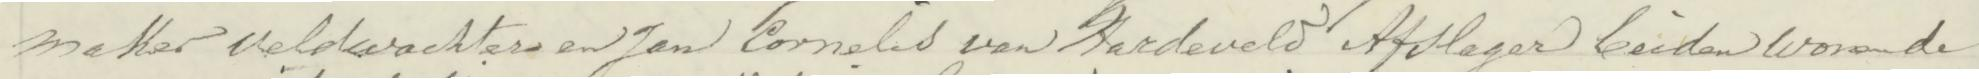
maker veldwachter en Jan Cornelis van Hardeveld Afslager beiden wonende
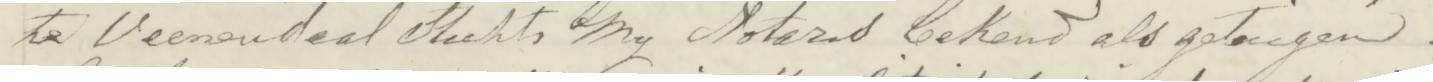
te Veenendaal Stichts my Notaris bekend als getuigen.
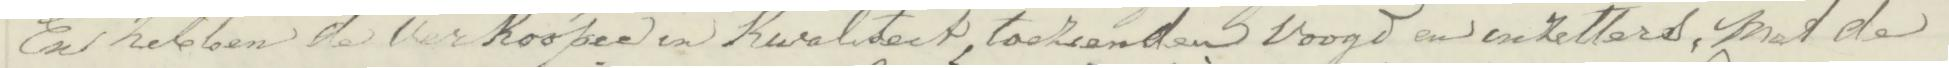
En hebben de verkooper in kwaliteit, toezienden voogd en inzetters, met de
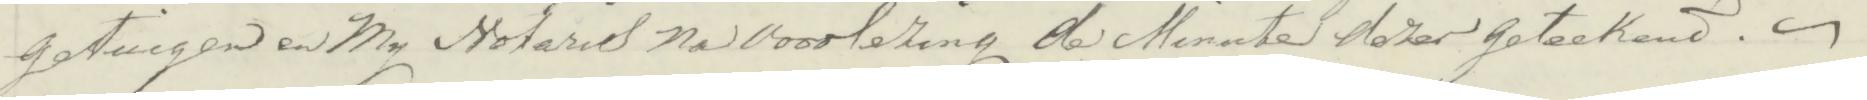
getuigen en my Notaris na voorlezing de Minute dezer geteekend.—
